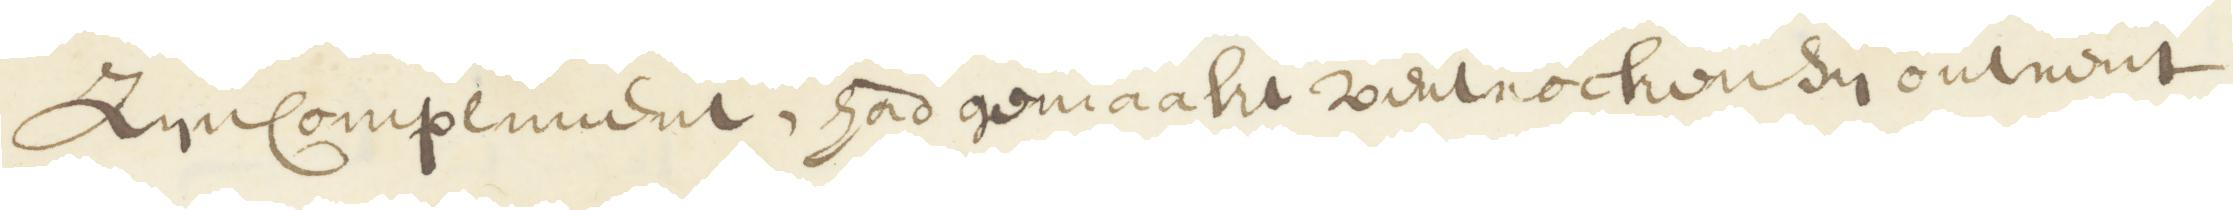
zijn Compliment, had gemaakt vertrockensy ontrent
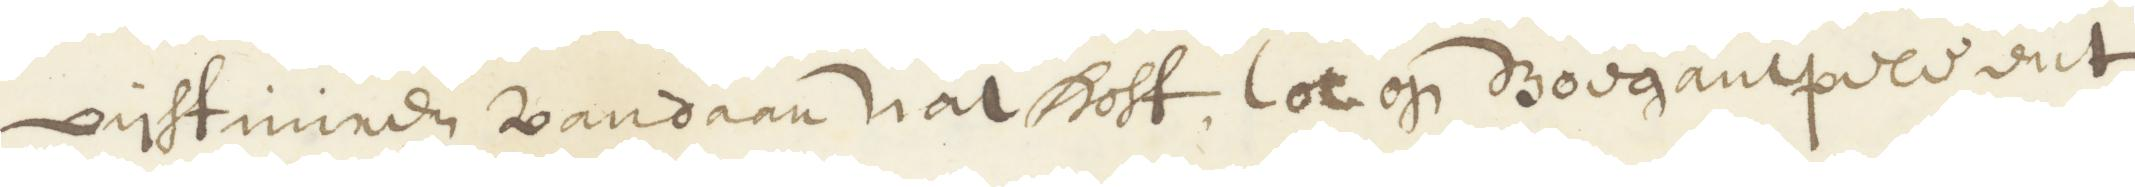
vijff uuren vandaar na't hoff, tot op Boegantpele ent
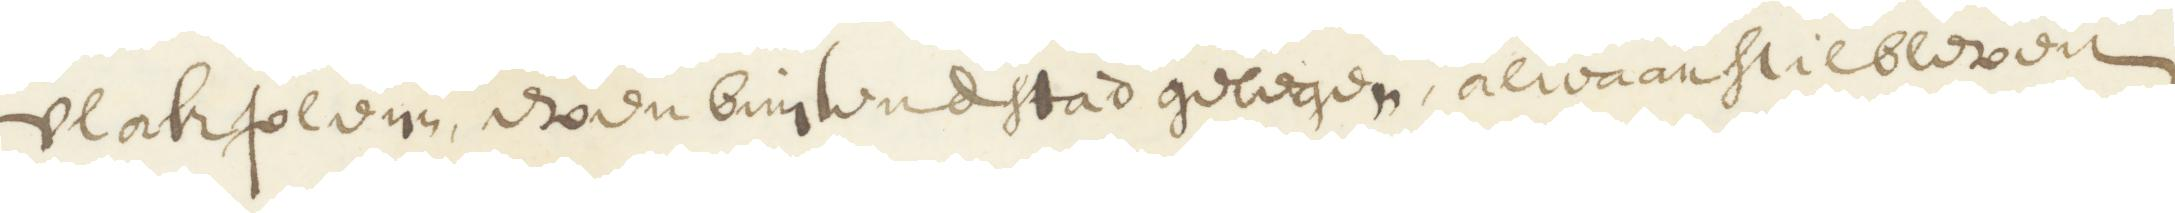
vlakpleijn, even buijtend'stad gelegen, alwaar stilbleven
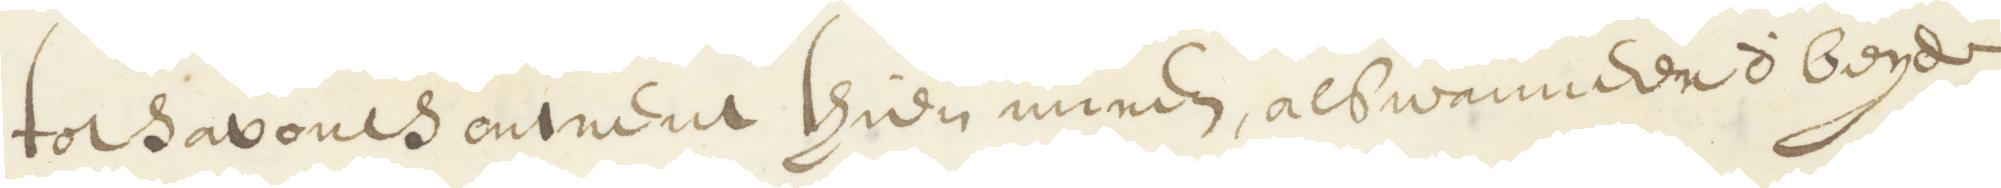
tot savonts ontrent thien uuren, als wanneer d’ beyde
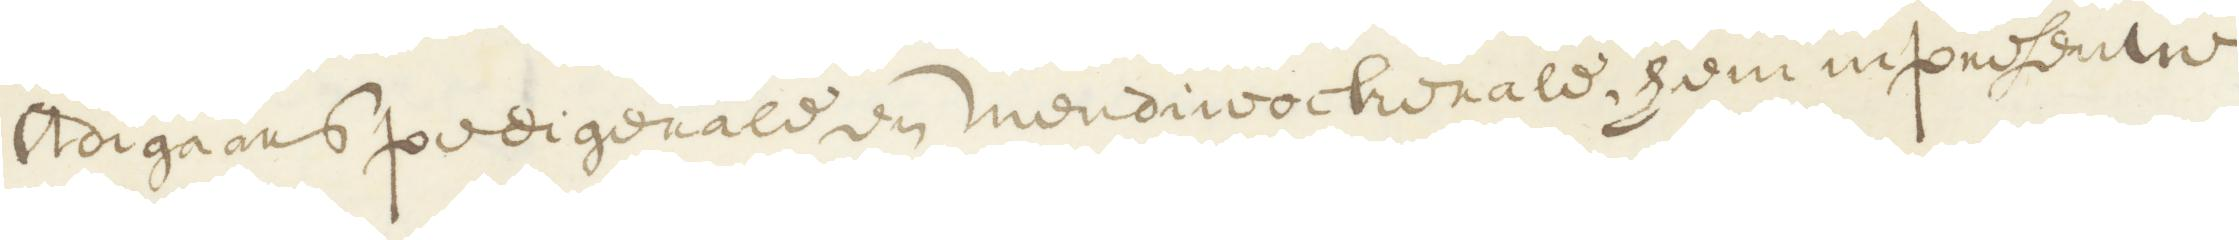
Adigaars pedigerale en mendiwockerale hem in presentie
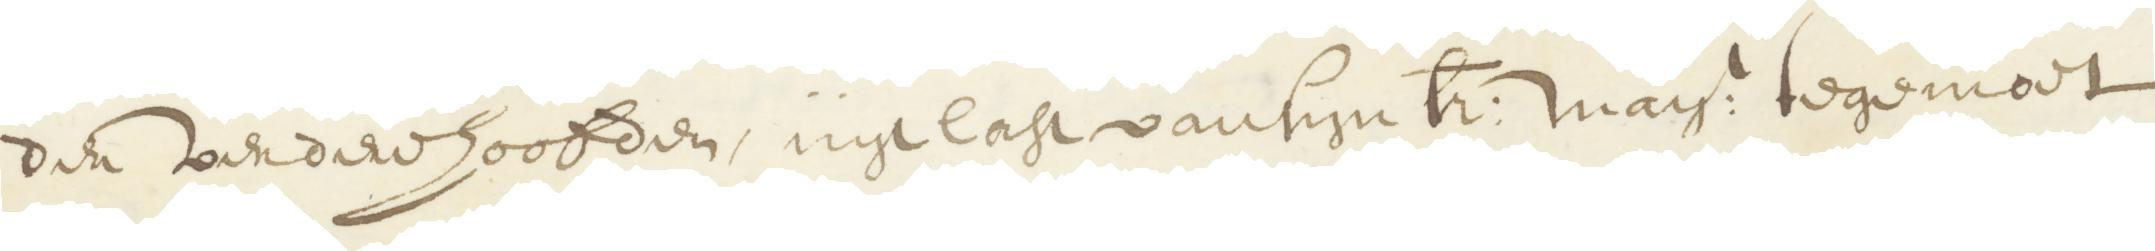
der verdere hoofden, uijt last vansyn k: maij:t tegemoet
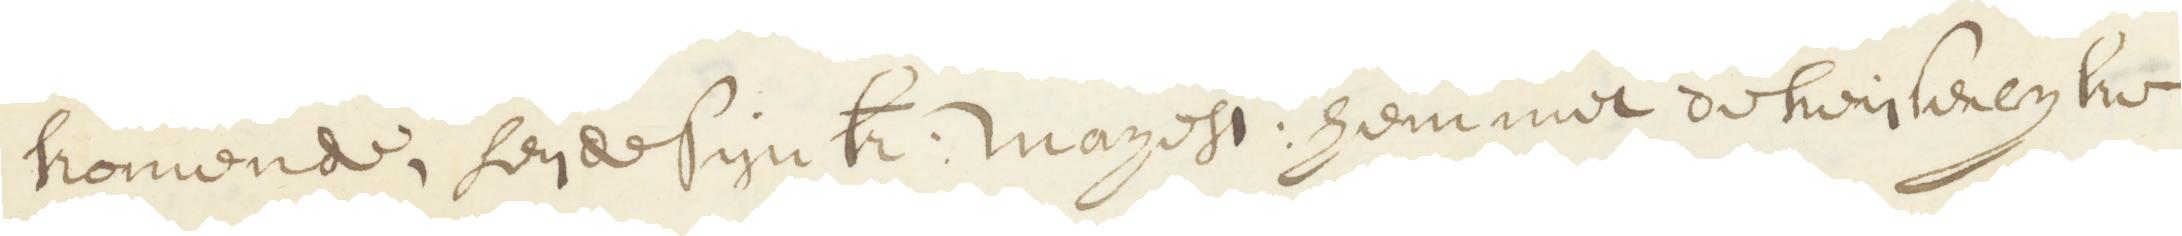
komende, seydesijn k: mayest:t hem met dekeijserlyke
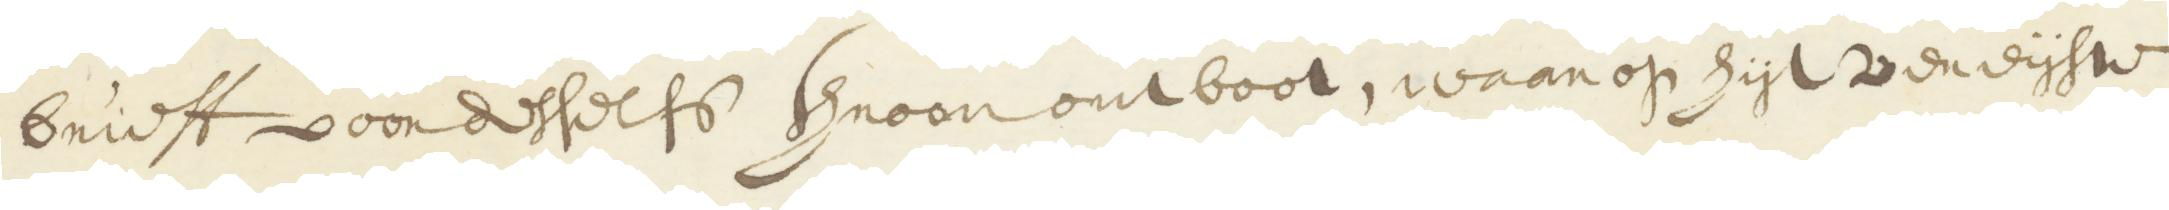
brieff voordesselfs throon ontboot, waar op hy't vereijste
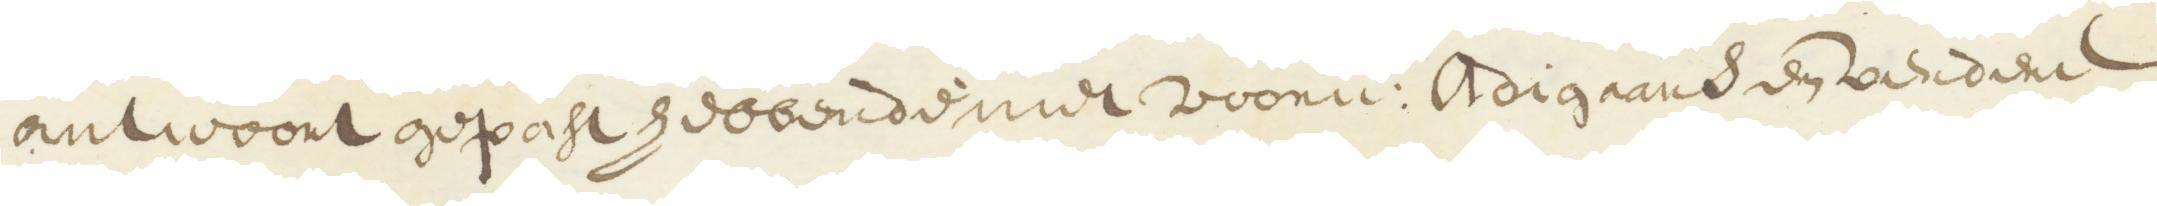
antwoort gepast hebbende met voorn: Adigaars en verdere
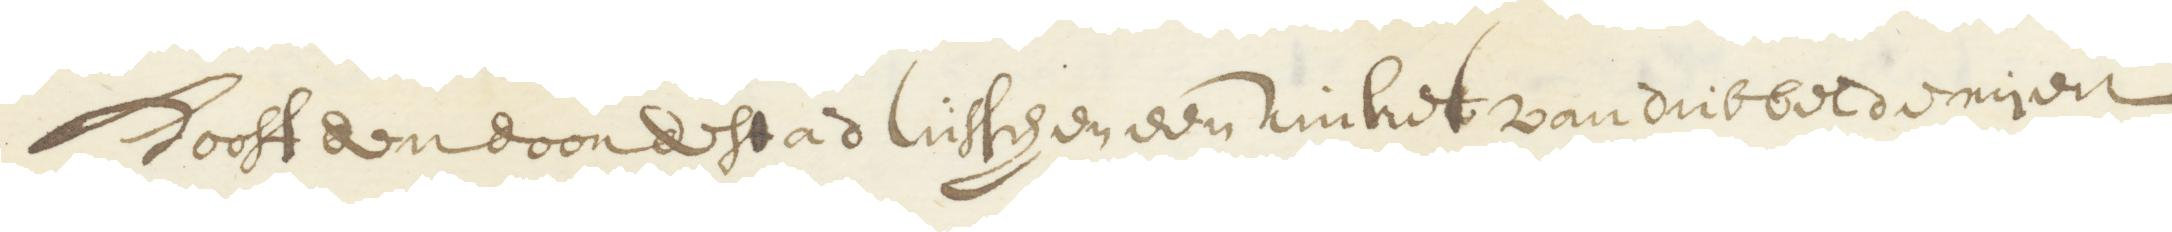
Hooff dendoordestad tusschen een rinket van dubbelde rijen
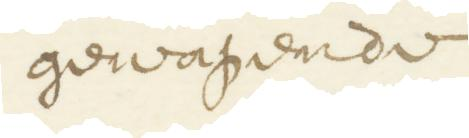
gewapende
